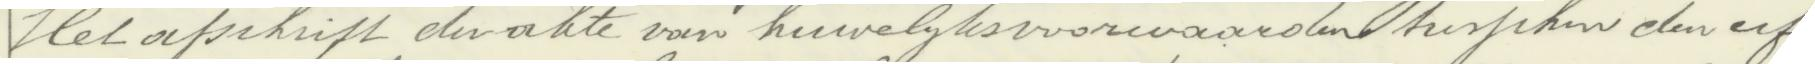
Het afschrift der akte van huwelyksvoorwaarden tusschen den erf
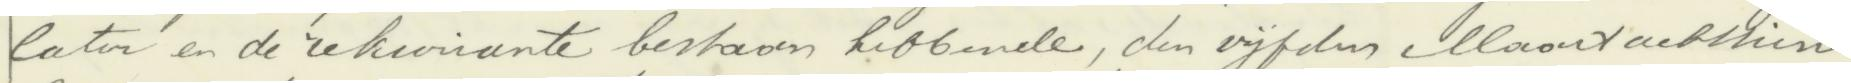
later en de rekwirante bestaan hebbende, den vijfden Maart achttien
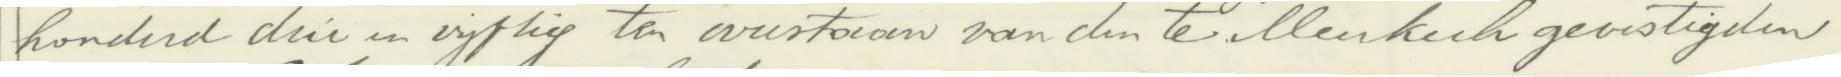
honderd drie en vijftig ten overstaan van den te Meerkerk gevestigden
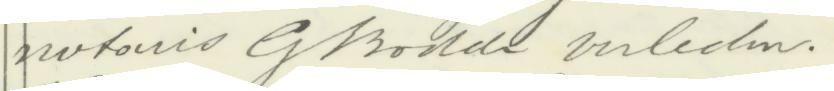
notaris G Bodde verleden.
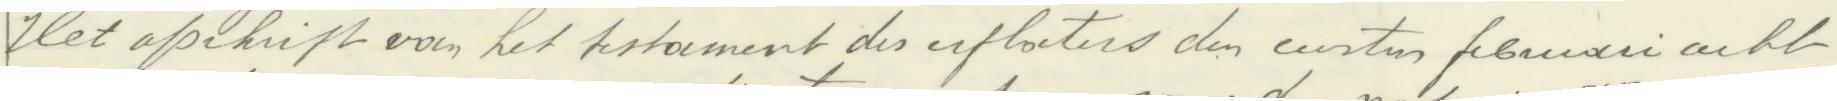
Het afschrift van het testament des erflaters den eersten februari acht
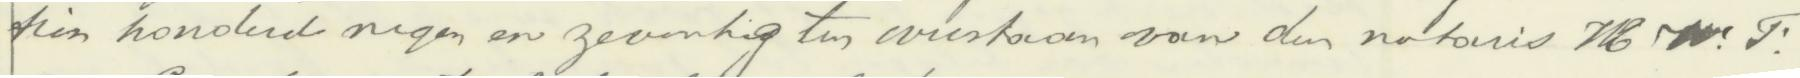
tien honderd negen en zeventig ten overstaan van den notaris H W: T:
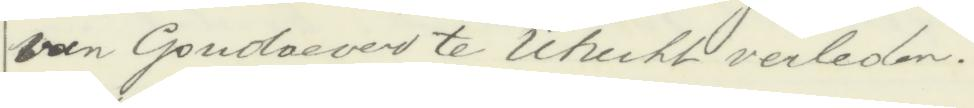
van Goudoever te Utrecht verleden.
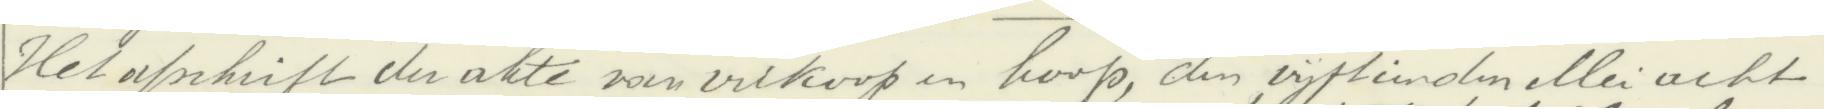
Het afschrift der akte van verkoop in koop, den vijftienden Mei acht
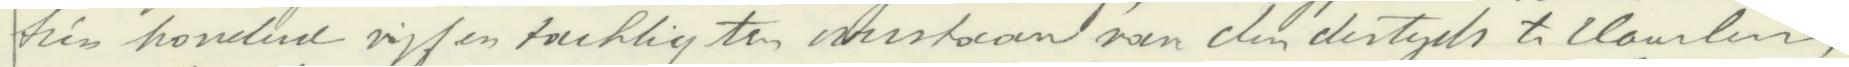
tien honderd vijf en tachtig ten overstaan van den destyds te Haarlem
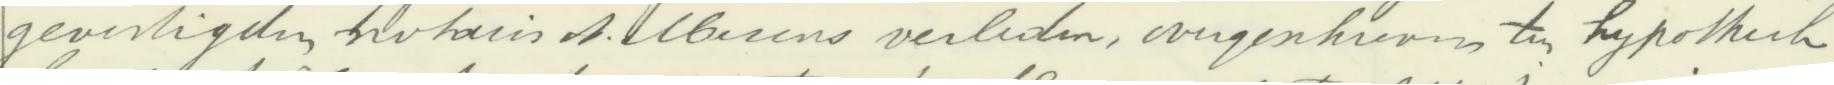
gevestigden notaris A. Meurs verleden, overgeschreven ten hypotheek
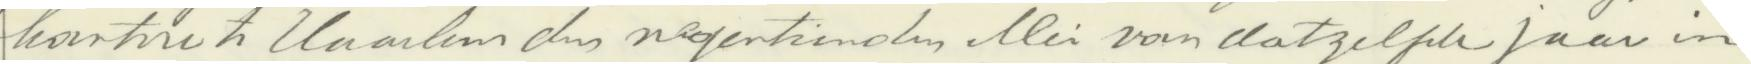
kantore te Haarlem den negentienden Mei van datzelfde jaar in
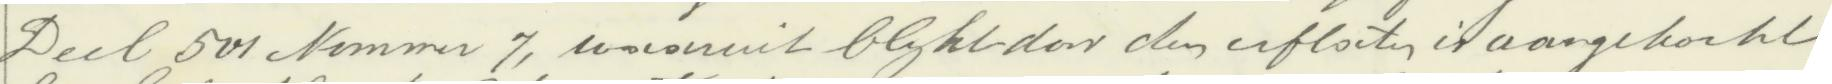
Deel 501 Nommer 7, waaruit blykt door den erflater is aangekocht
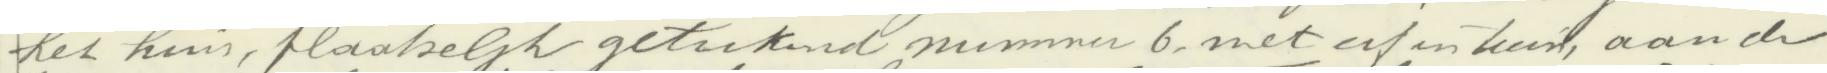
het huis, plaatselyk geteekend nummer 6, met erf en tuin, aan de
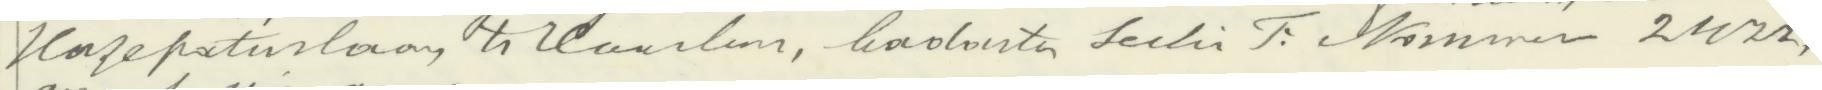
Hazepaterslaan te Haarlem, kadaster sectie F. Nummer 2422,
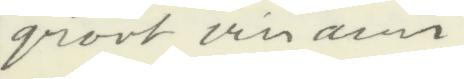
groot vier aren
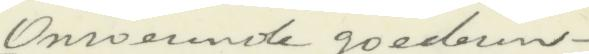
Onroerende goederen
